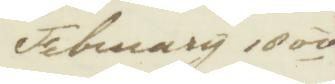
Februarij 1800
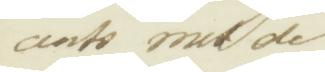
cents met de38 opc Een
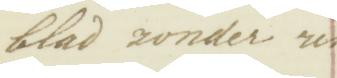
blad zonder renvooijen
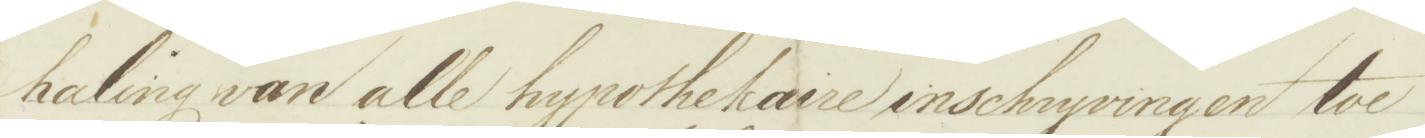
haling van alle hypothekaire inschryvingen toe
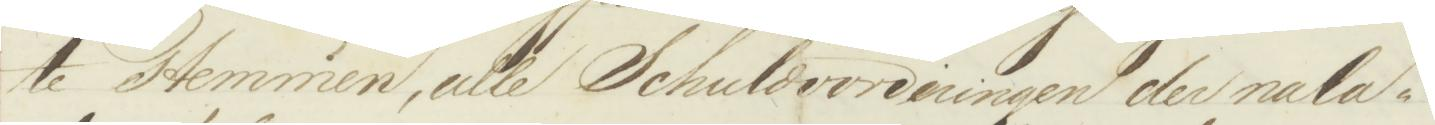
te stemmen, alle Schuldvorderingen der nala„
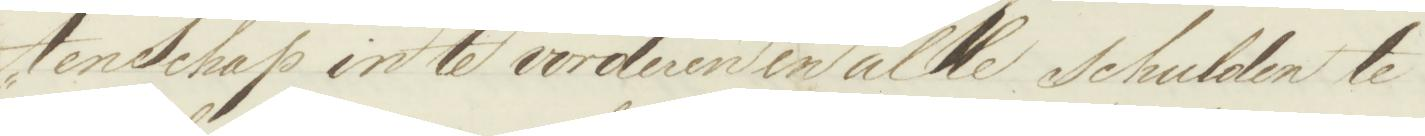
„tenschap in te vorderen en alle schulden te
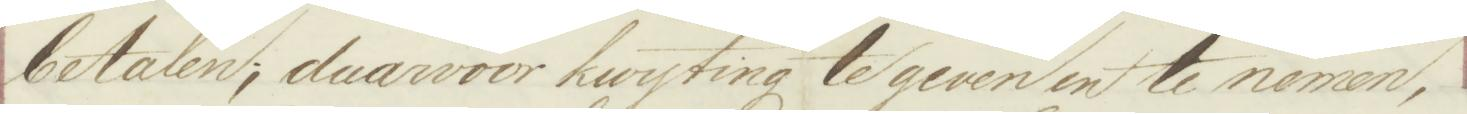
betalen; daarvoor kwyting te geven en te nemen,
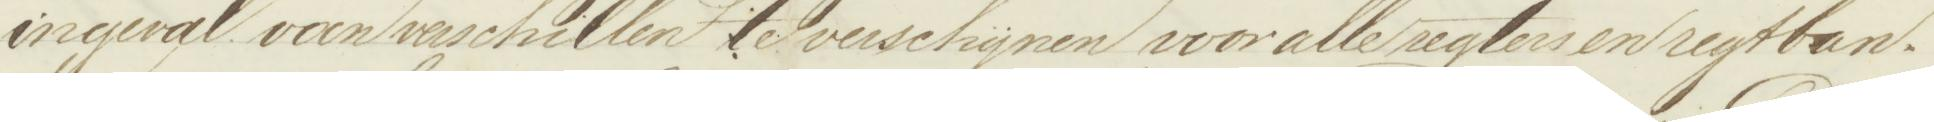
ingeval van verschillen te verschijnen voor alle regters en regtban„
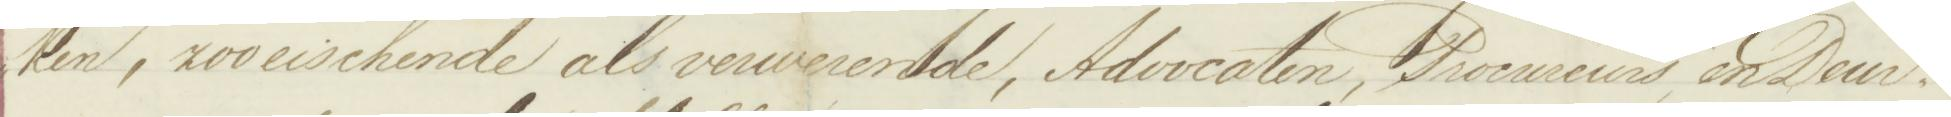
ken, zoo eischende als verwerende, Advocaten, Procureurs en Deur„
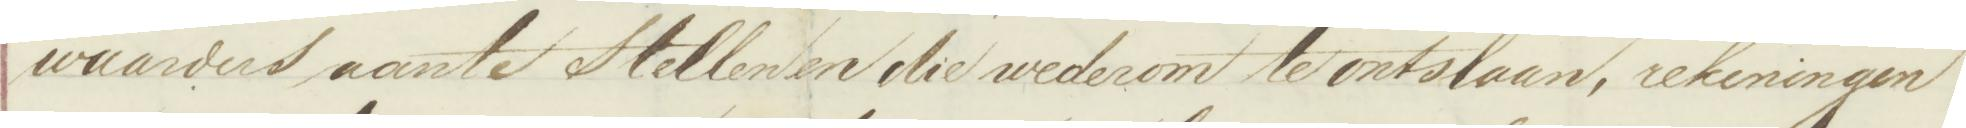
waarders aan te stellen en die wederom te ontslaan, rekeningen
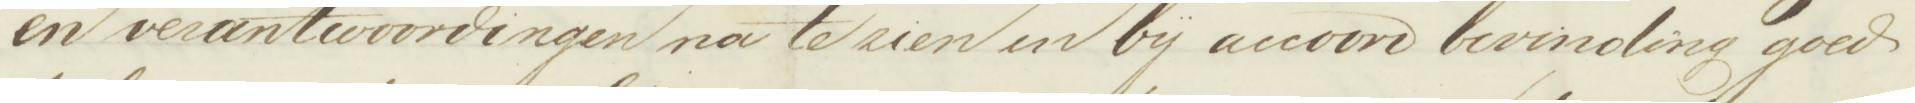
en verantwoordingen na te zien en bij accoord bevinding goed
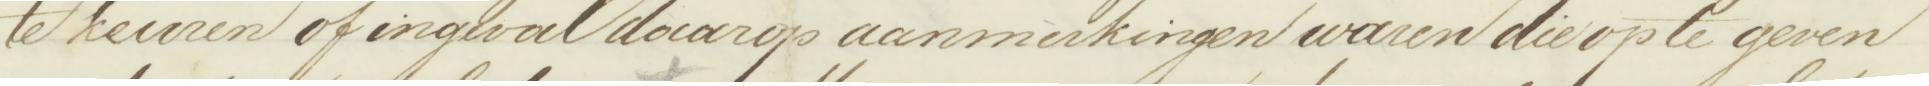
te keuren of ingeval daarop aanmerkingen waren die op te geven
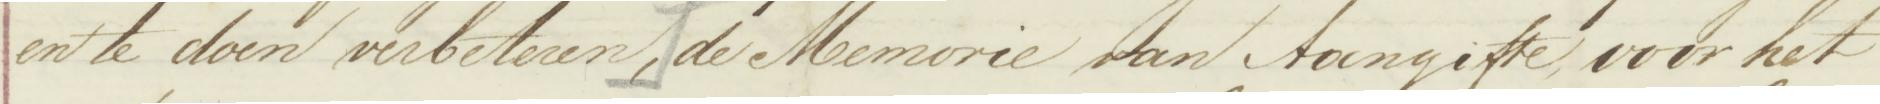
en te doen verbeteren, de Memorie van Aangifte, voor het
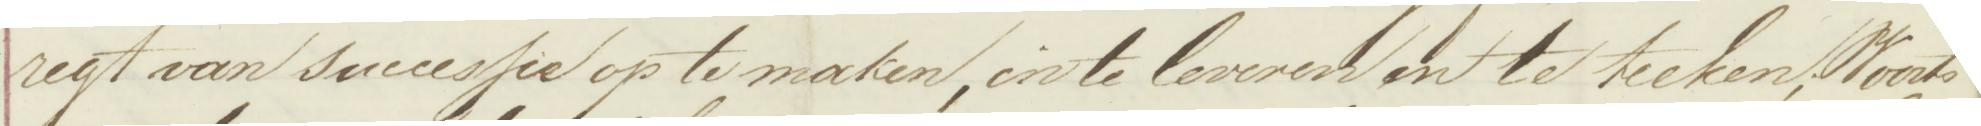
regt van successie op te maken, in te leveren en te teeken, Voorts
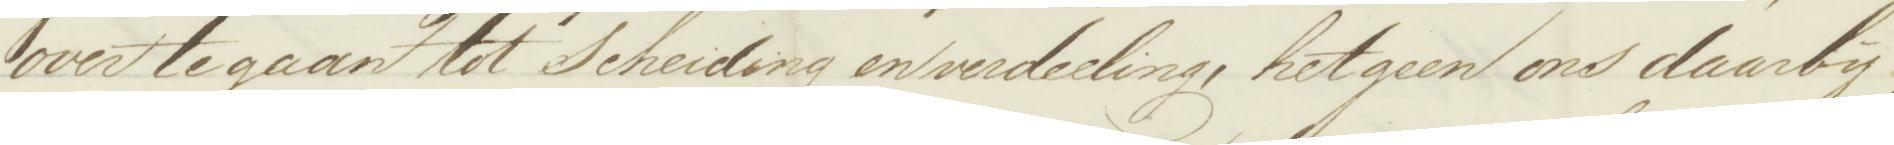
over te gaan tot scheiding en verdeeling, hetgeen ons daarbij
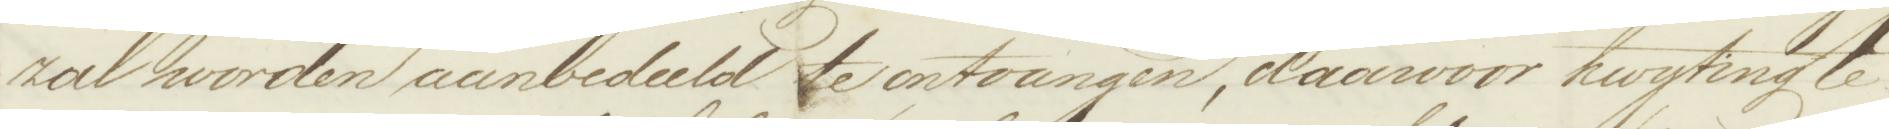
zal worden aanbedeeld te ontvangen, daarvoor kwyting te
